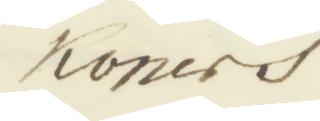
Kopers
